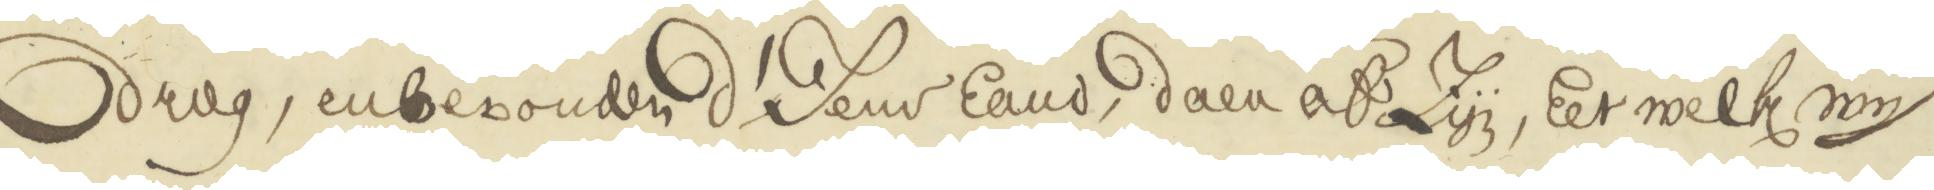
dreg, en bevonden d’Eene hand, daer af zijn, het welk wij
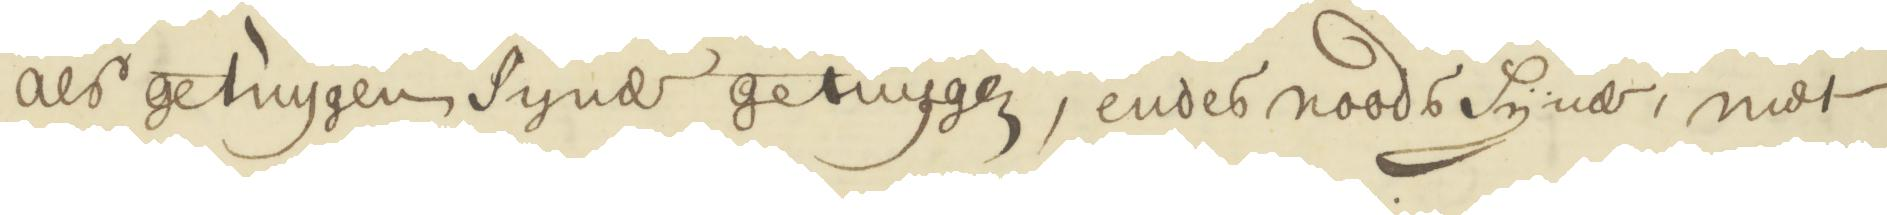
als getuijgen sijnde getuijgen, endes noods sijnde, met
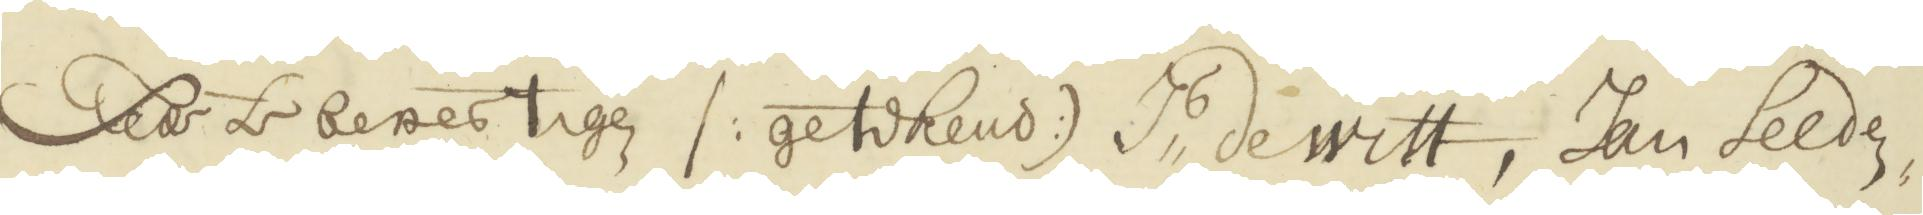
Eede te bevestigen /:getekend:) I„s de witt, Ian selden„
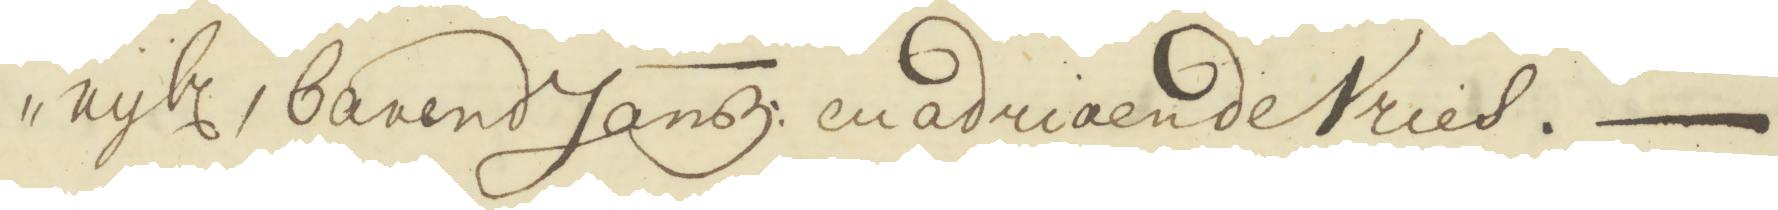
„rijk, barend Jansz: en adriaen de Vries. —
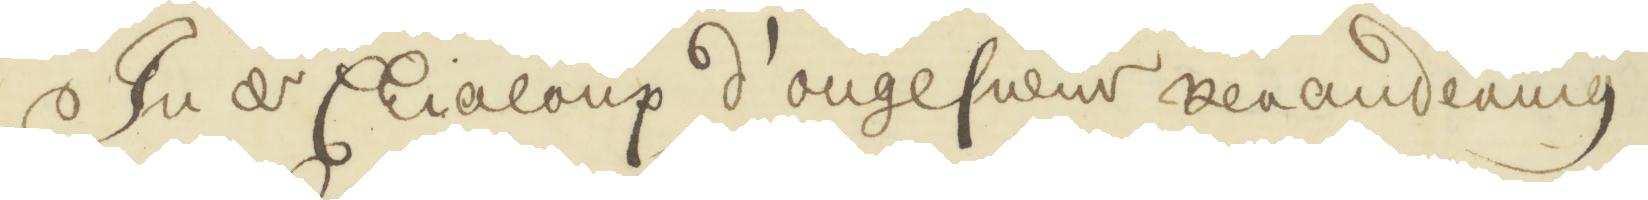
Jn de Chialoup d’ ongesiene verandering
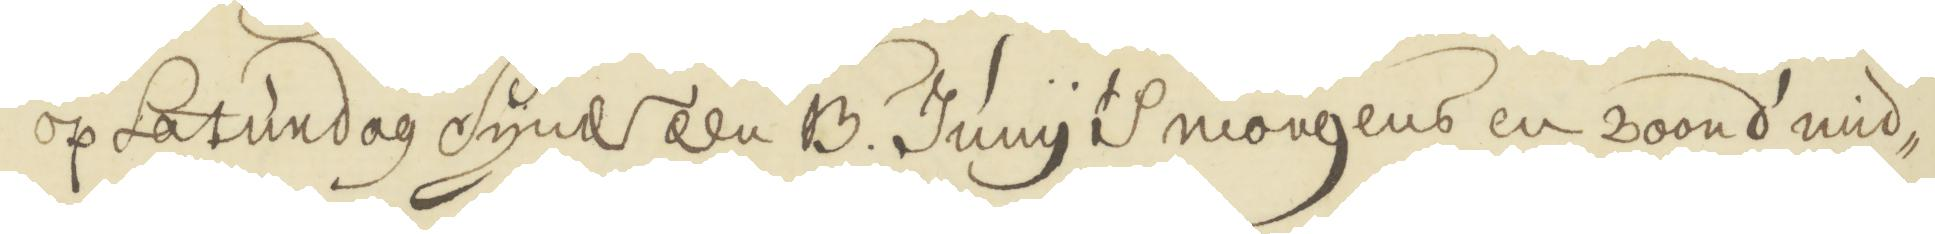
op saturdag sijnde den 13.' Iunij 's morgens en voor d’ mid„
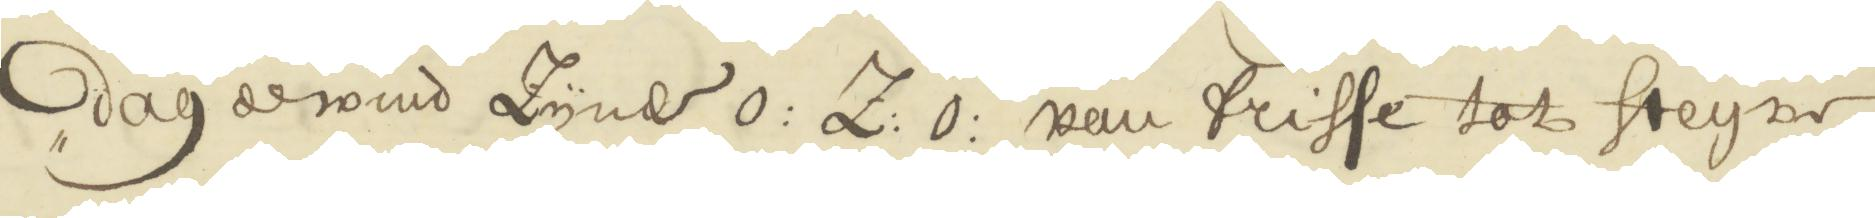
„dag de wind zijnde o: z: o:t van frisse tot steijve
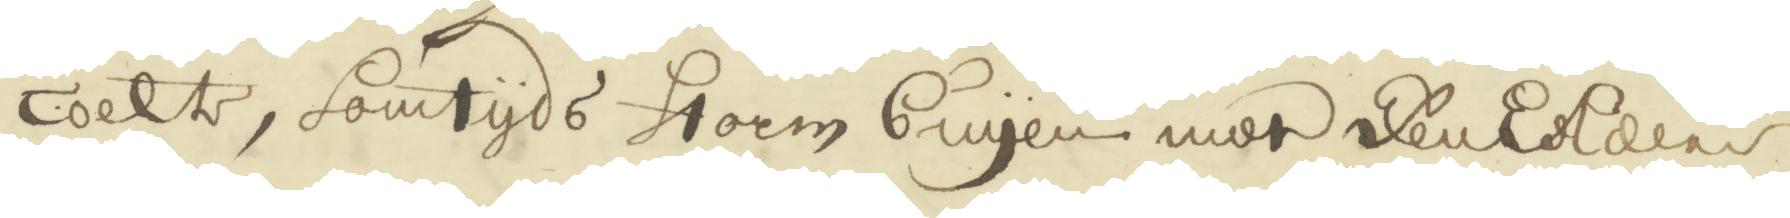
coelte, somtijds storm buijen met Een heldere
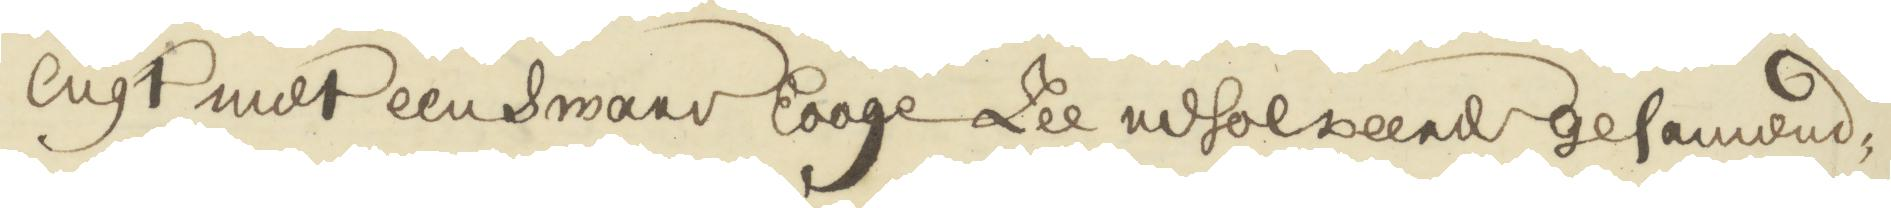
lugt met een sware hooge zee resolveerde gesamend„
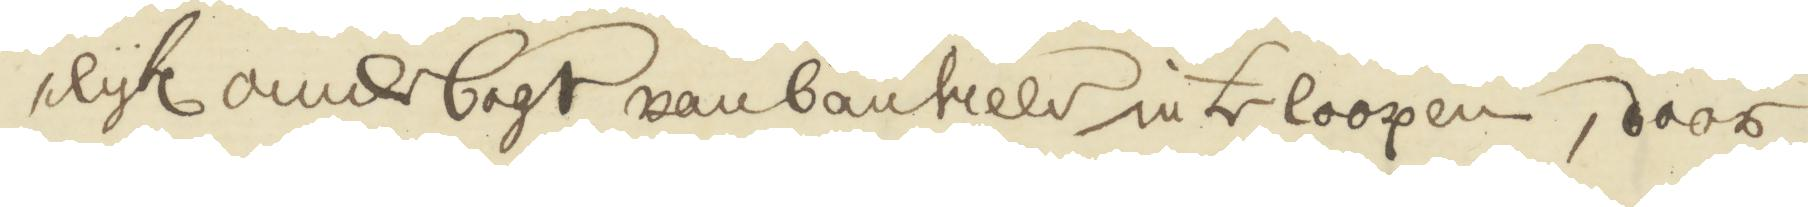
,lijk om de bogt van bankele in te loopen, door
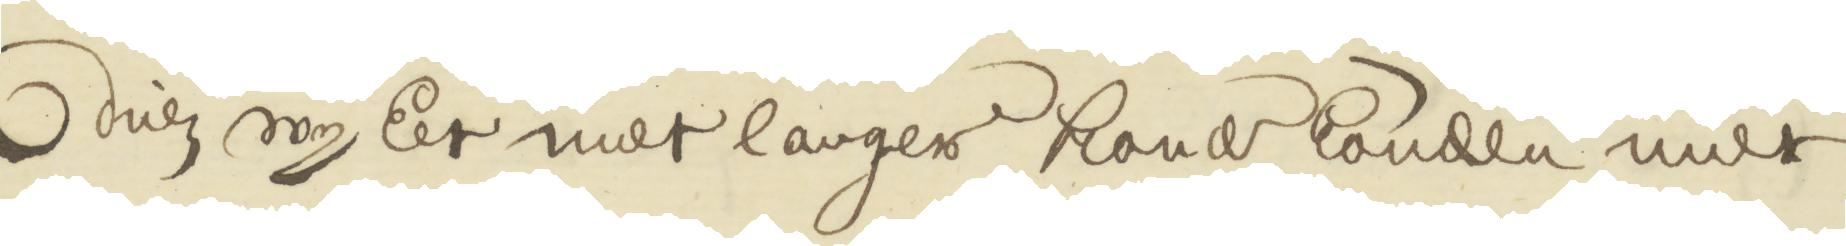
dien wij het niet langer konde houden met
